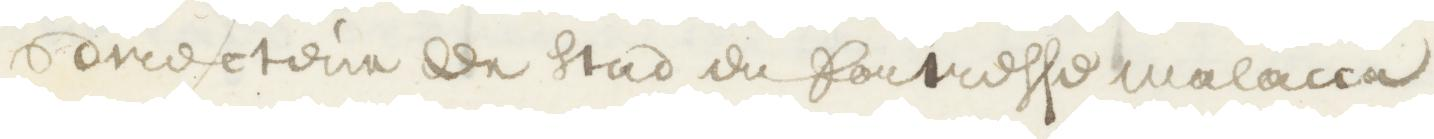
directeur der stad en fortresse malacca
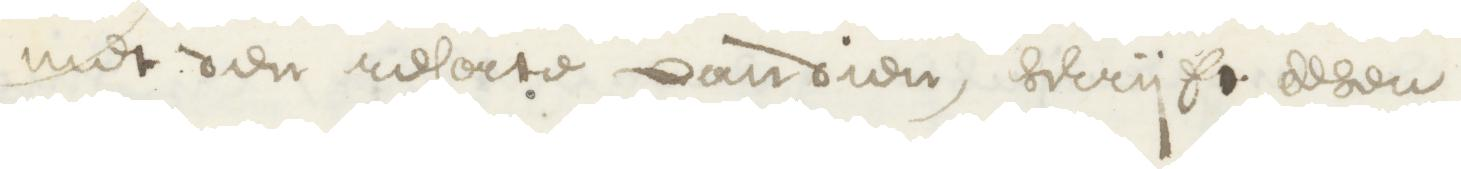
met den resorte van dien, schrijft desen
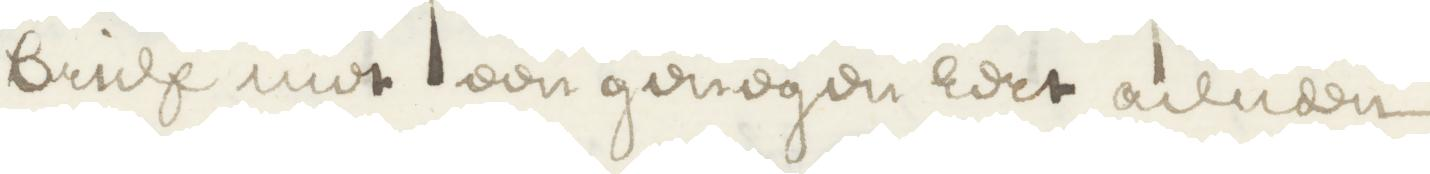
brief met een genegen hert aen den
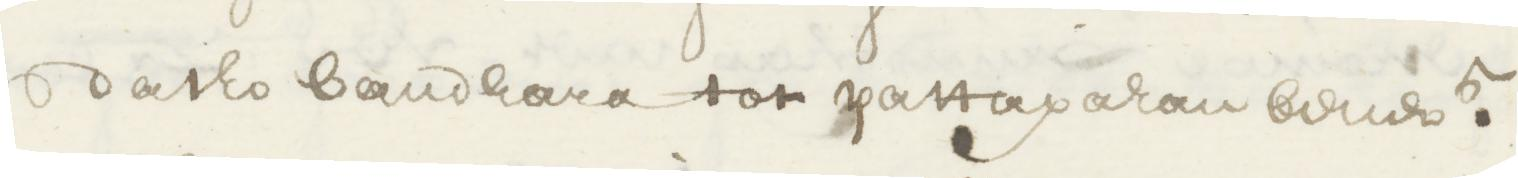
datho bandhara tot pattapahan benev.s
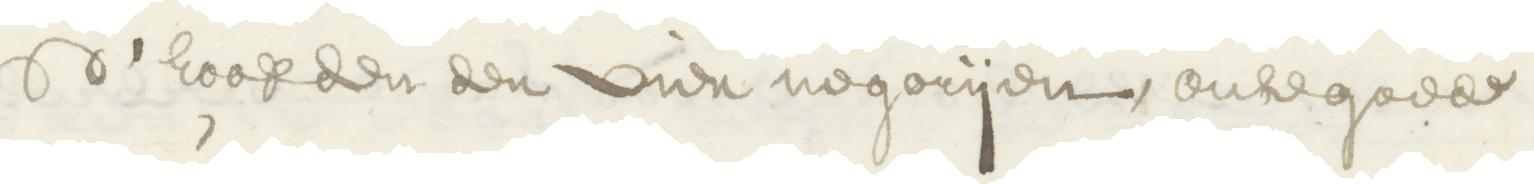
d’ hoofden der vier negorijen, onse goede
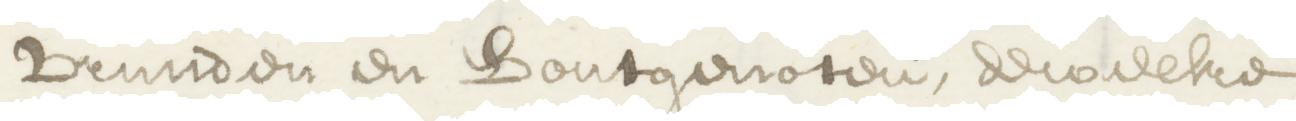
vrunden en bontgenoten, dewelke
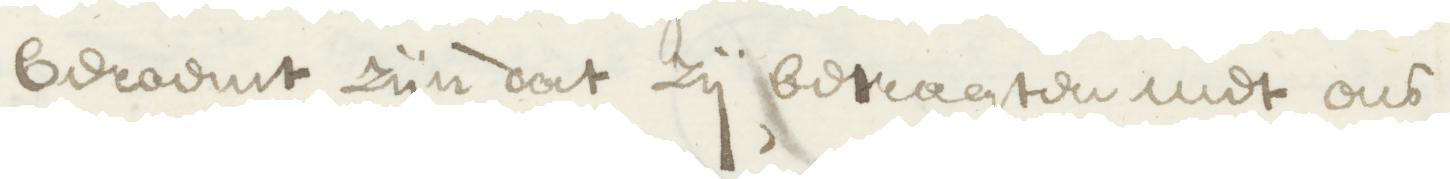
beroemt zijn dat zij betragten met ons
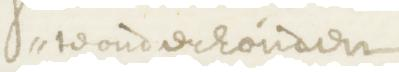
„te onderhouden
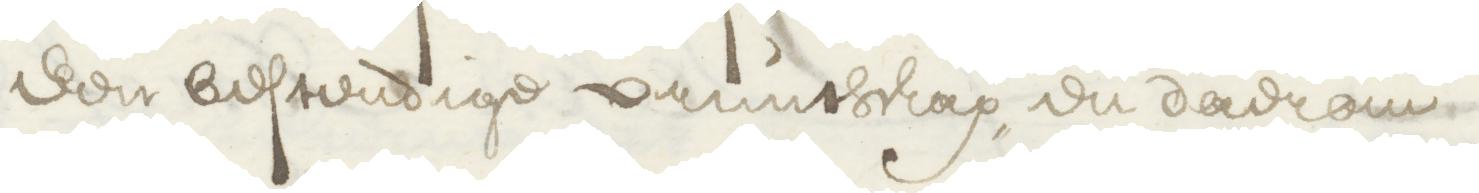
Een bestendige vruntschap„ en daerom
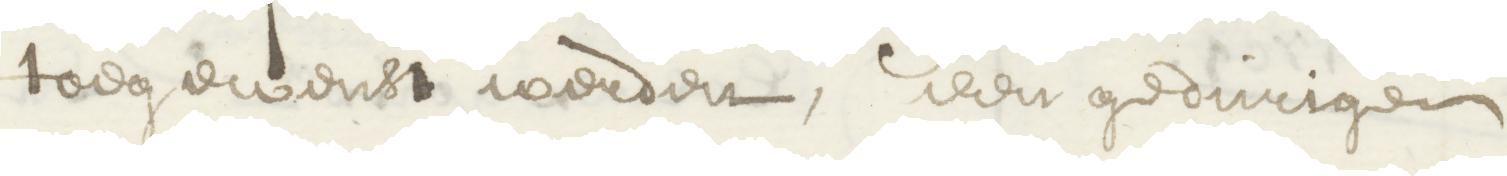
toegewenst werden, een gedurigen
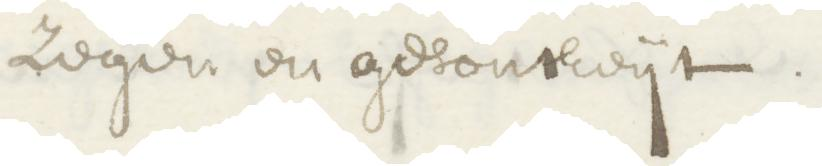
zegen en gesontheijt.
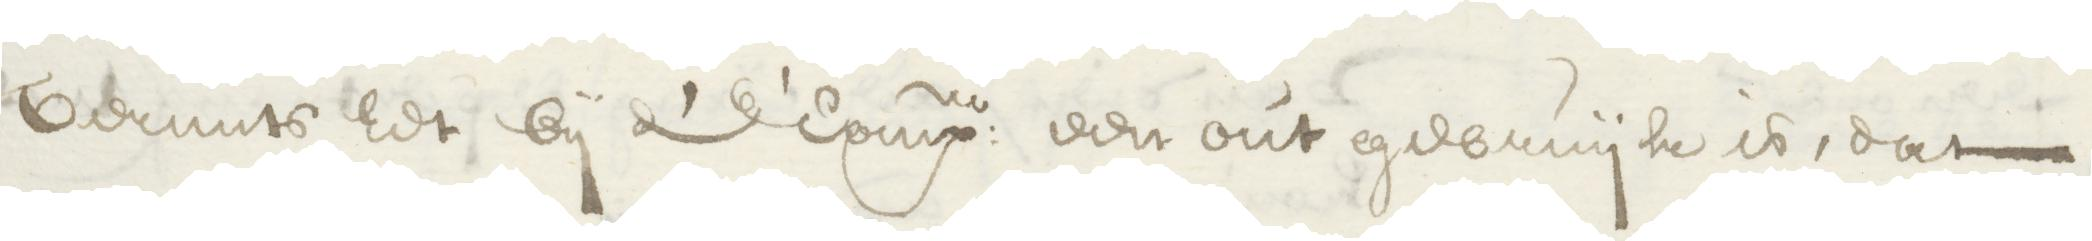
Vermits het bij d' E' Comp: een out gebruijk is, dat
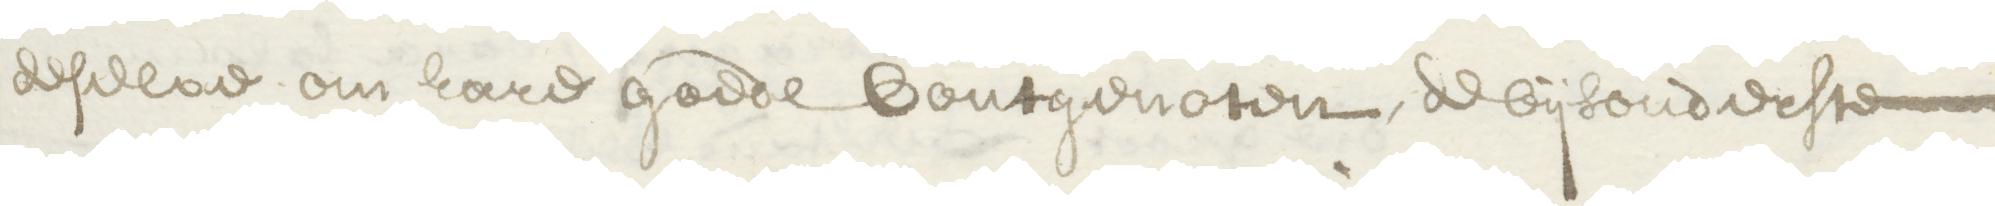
deselve om hare goede bontgenoten, de bijsonderste
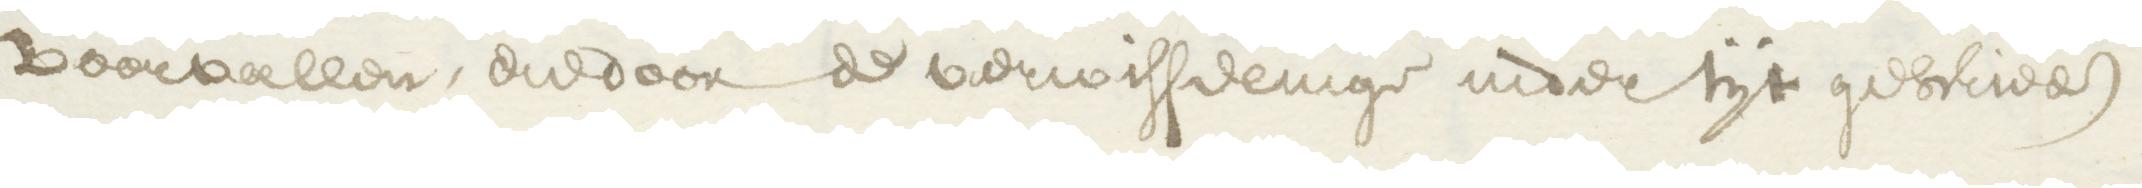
voorvallen, die door de verwisselinge inder tijt geschieden
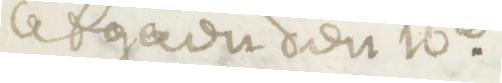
afgaen den 16.e
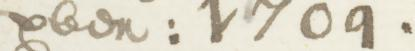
xber: 1704.
